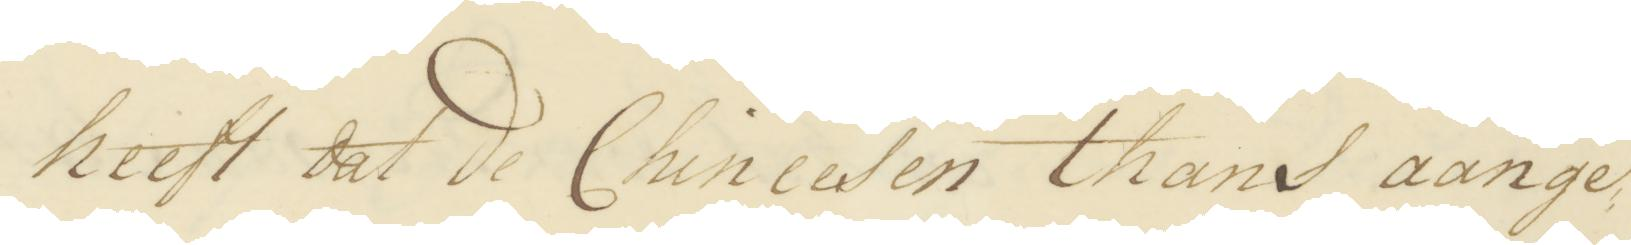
heeft dat de Chineesen thans aange„
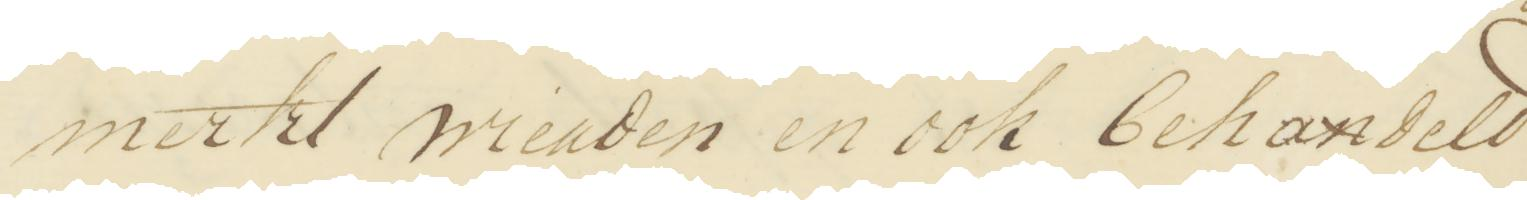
merkt wierden en ook behandeld
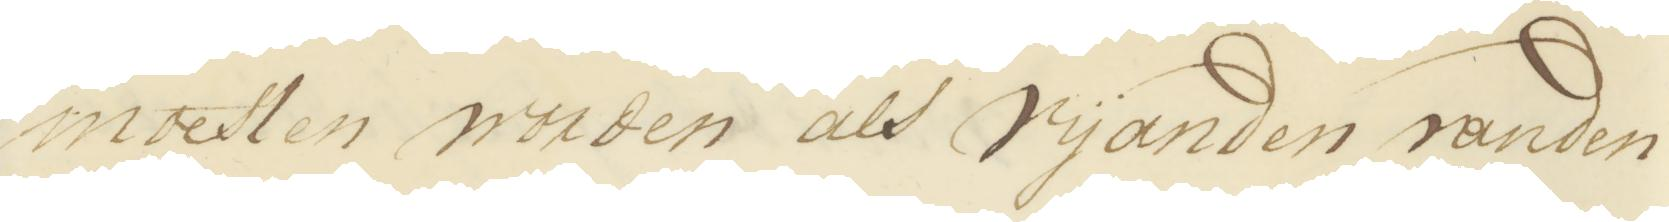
moesten worden als vijanden vanden
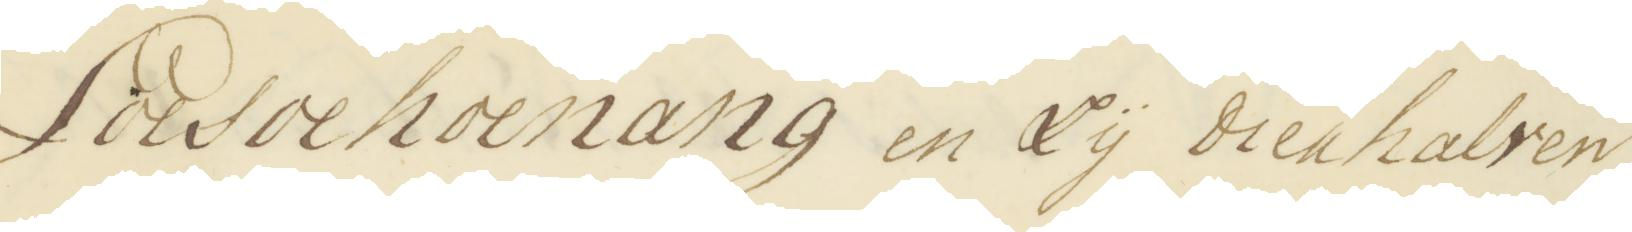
Soesoehoenang en zij dierhalven
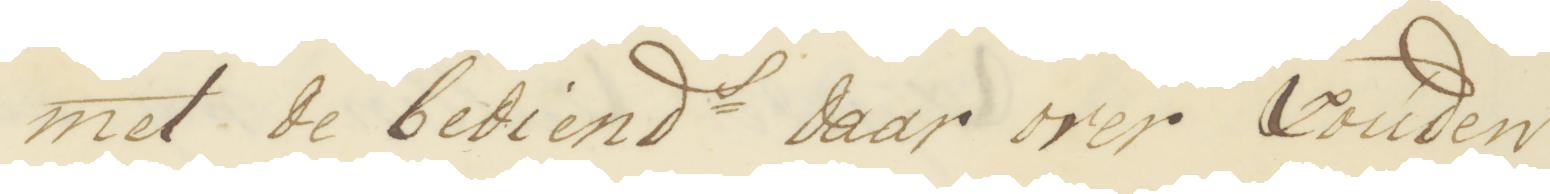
met de bediend=s daar over zouden
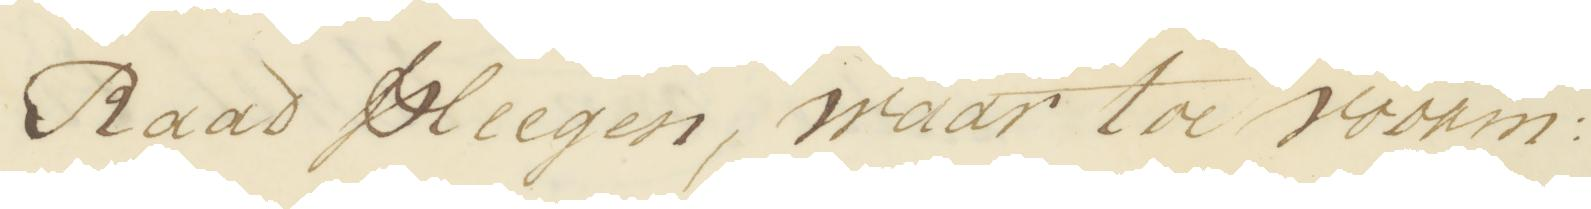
Raad Pleegen, waar toe voorm:
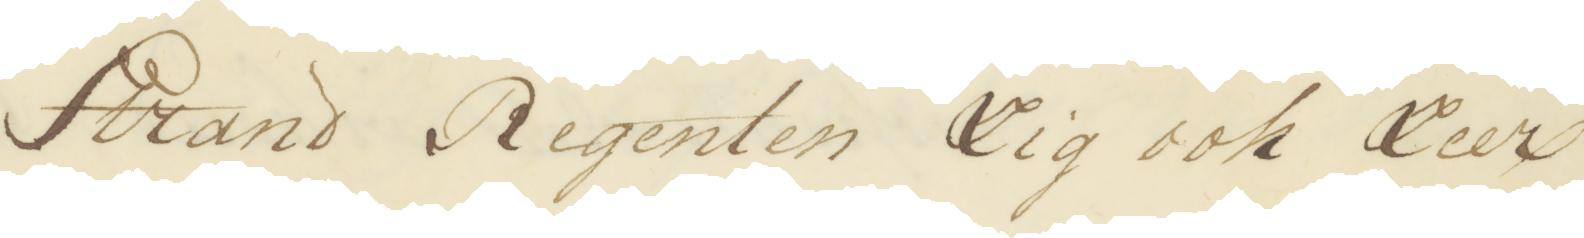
Strand Regenten zig ook zeer
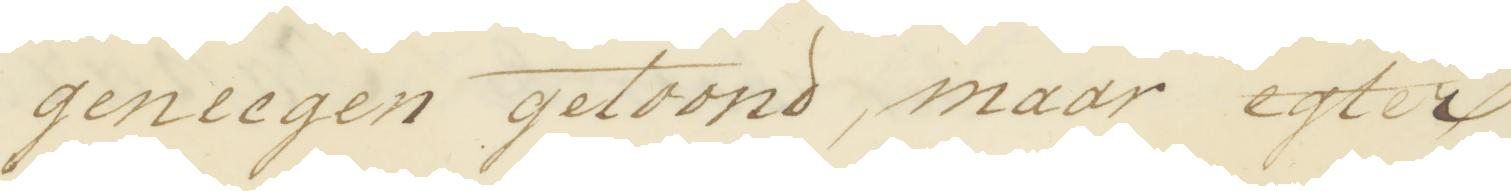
geneegen getoond, maar egter
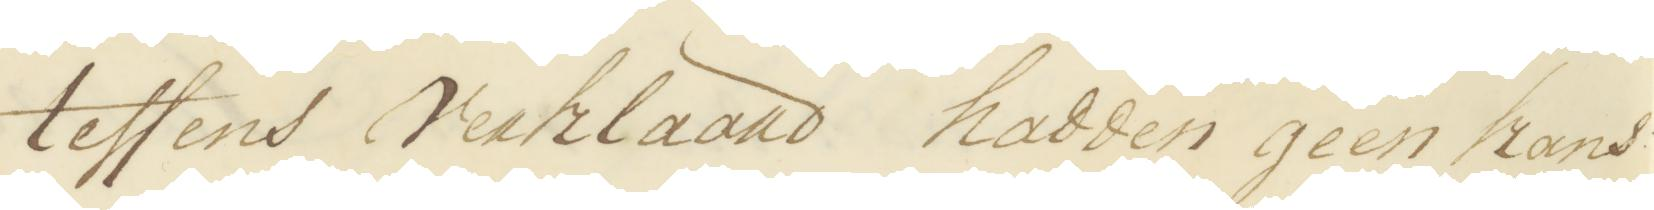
teffens verklaard hadden geen kans
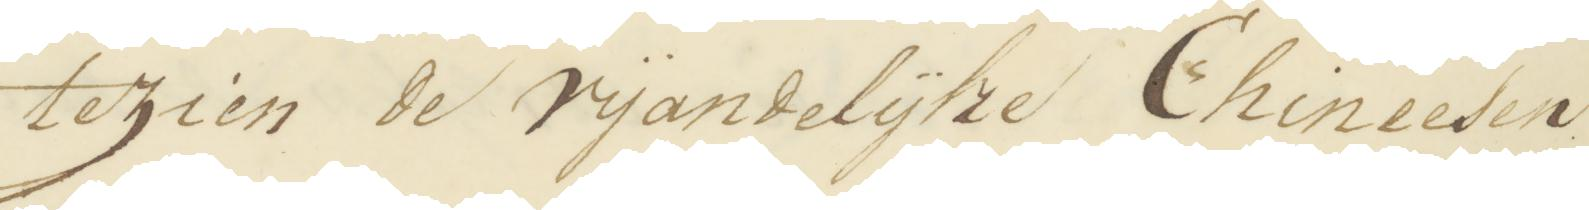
tezien de vijandelijke Chineesen
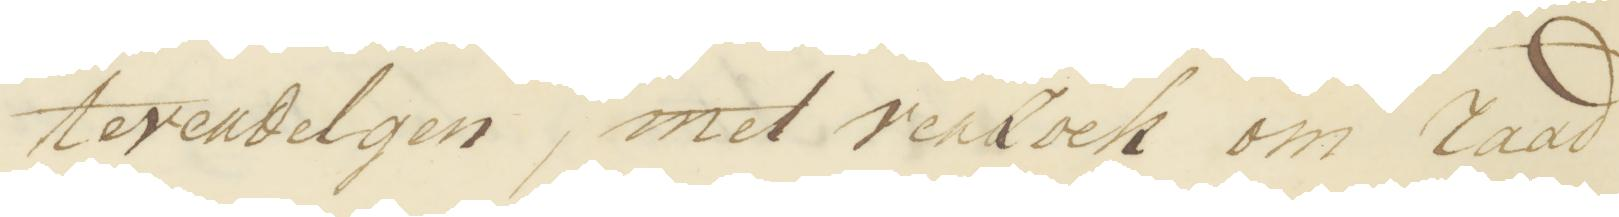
teverdelgen, met verzoek om raad
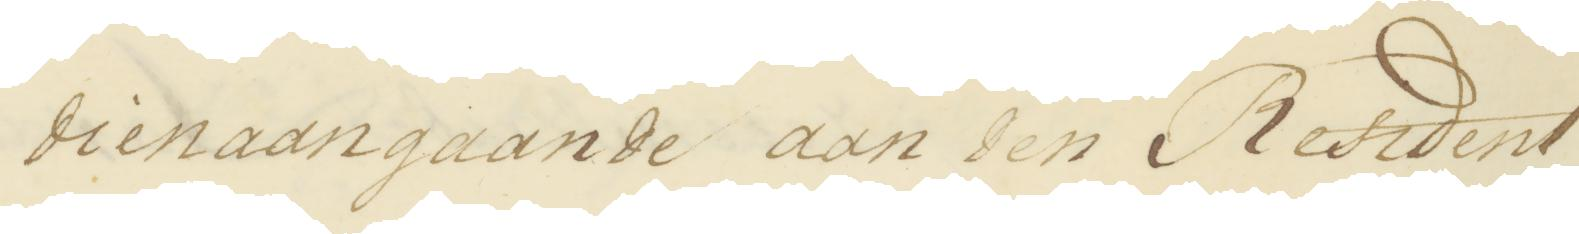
dienaangaande aan den Resident
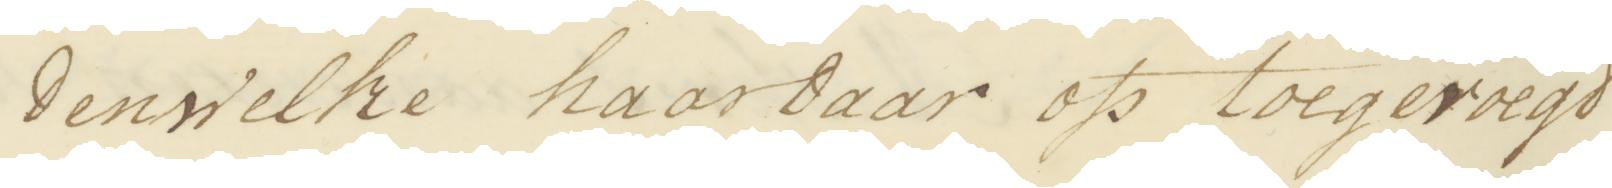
denwelke haardaar op toegevoegd
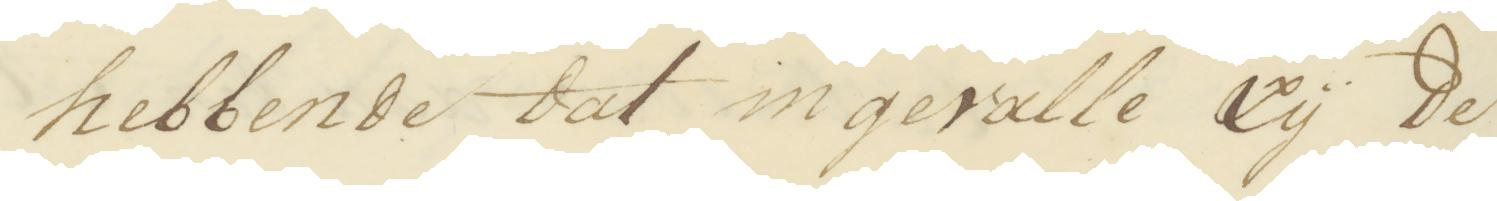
hebbende dat in gevalle zij de
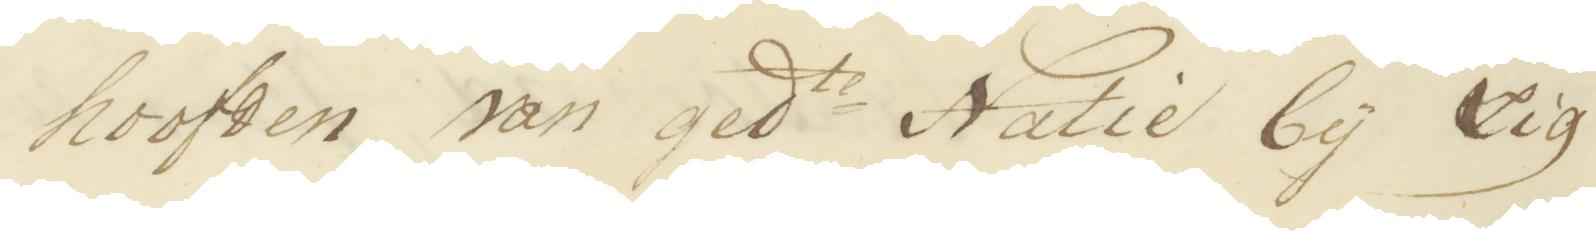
hoofden van ged=te Natie bij zig
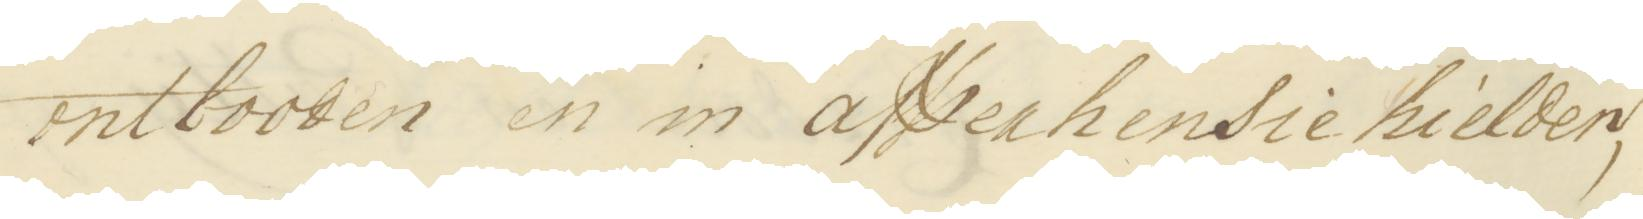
ontbooden en in apperhensie hielden,
